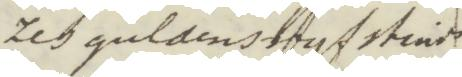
zes guldens vyf stuivrs
